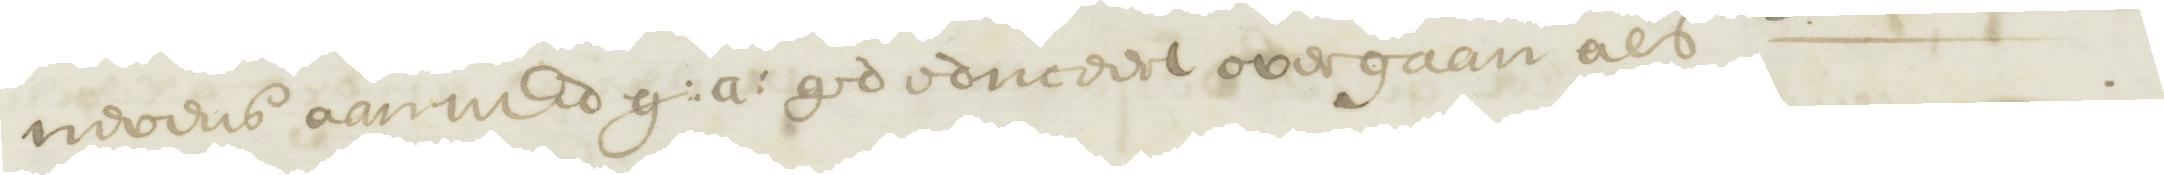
nevens aan uEd g: a: gededuceert overgaan als —
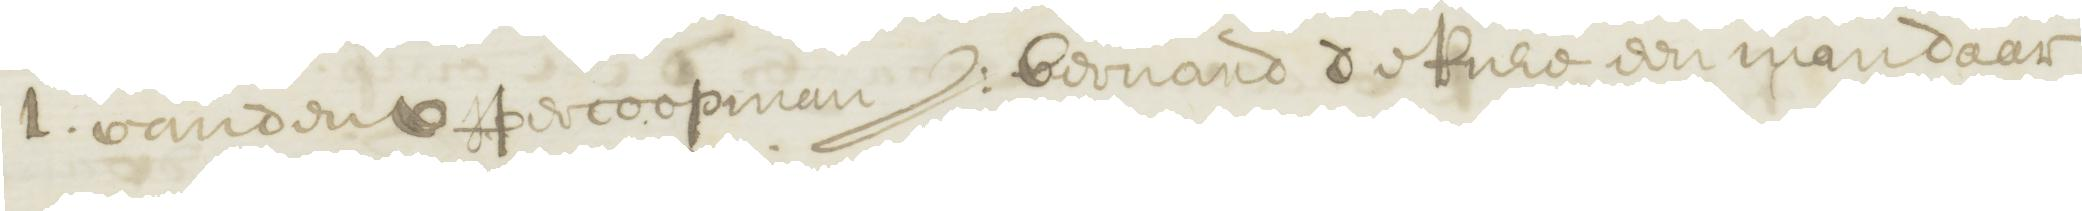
1. van den Oppercoopman J: bernard de Ruhe een man daar
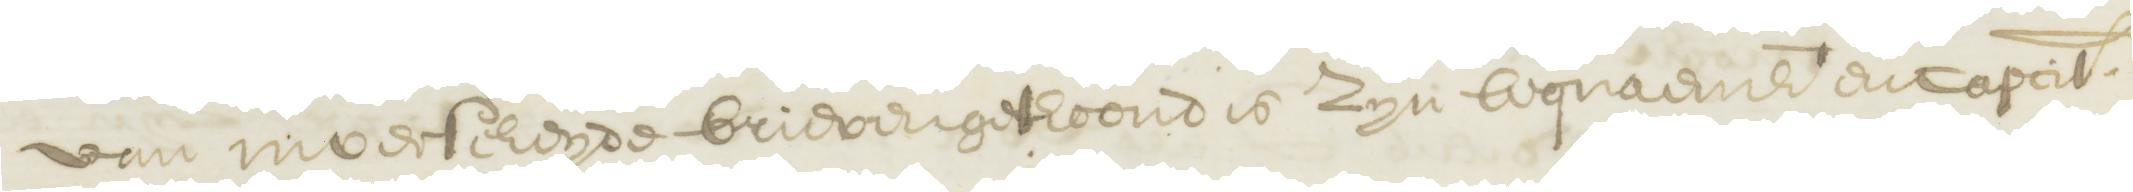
van in verscheijde brieven gethoond is zijn bequaemht en capcit.
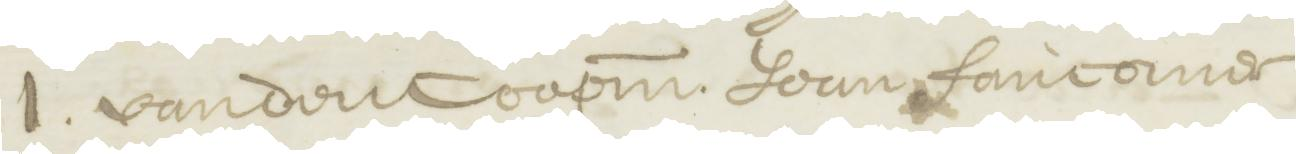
1. van den Coopm. Iean fauconier
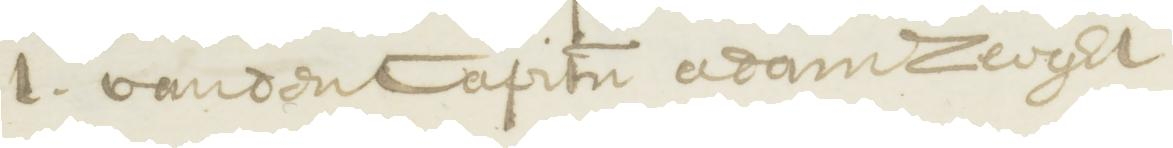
1. van den Capitn adam zleght
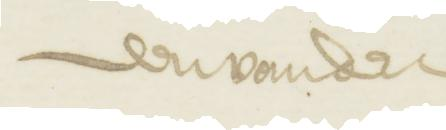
een van den
